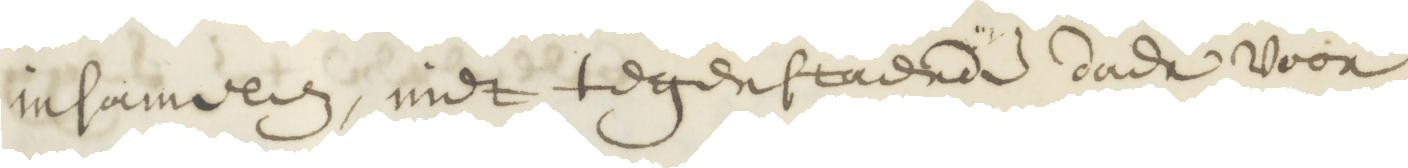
insamelen, niet tegenstaende daer voor
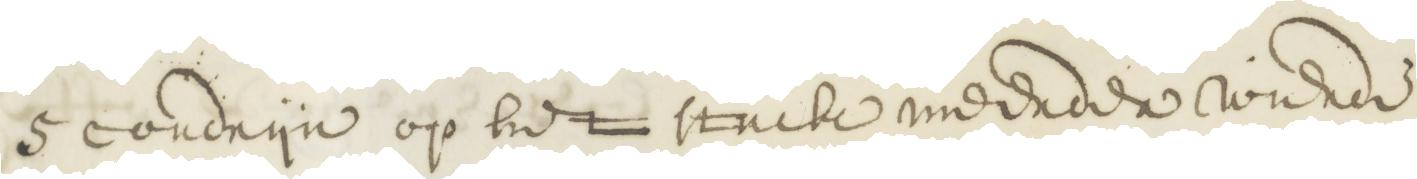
5 cordrijn op het stuck meerder wierde
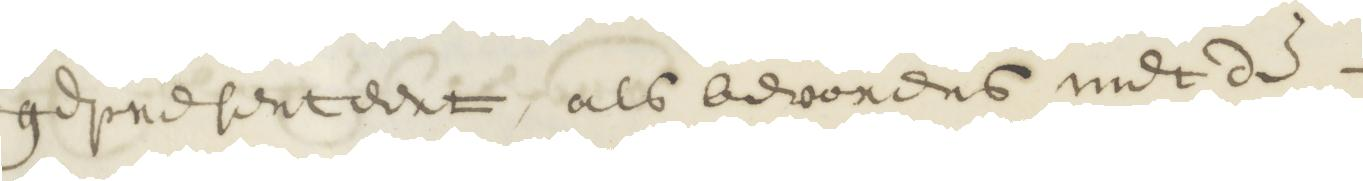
gepresenteert, als bevorens met de
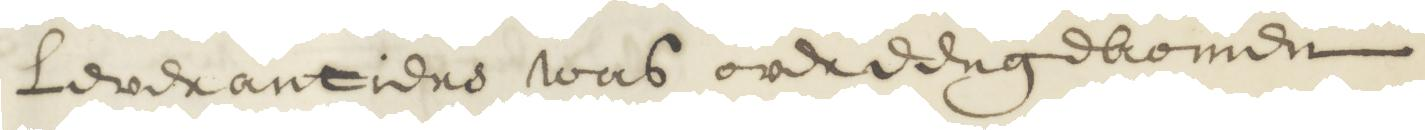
leveranciers was overeengekomen
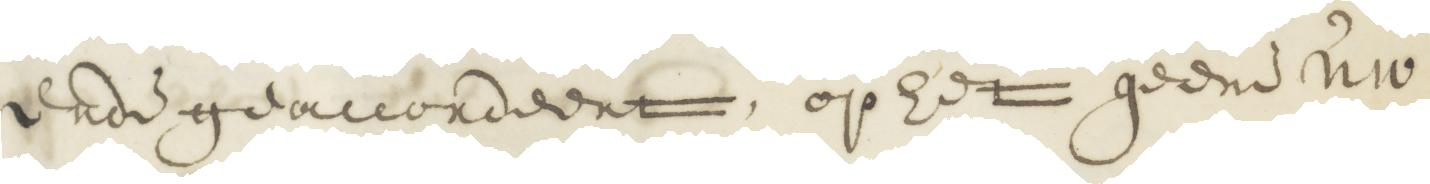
Ende geaccordeert, op het geene uw
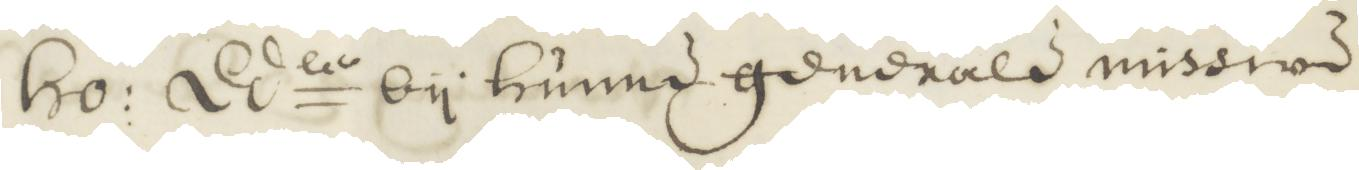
Ho: Ed=le bij hunne generale missive
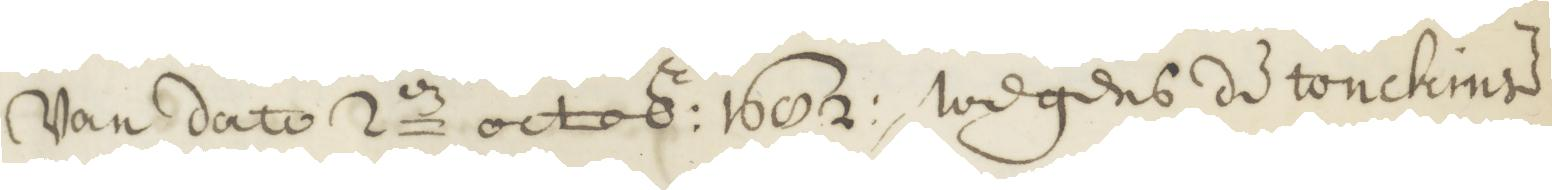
van dato 2=en octob: 1682:, wegens de tonckinse
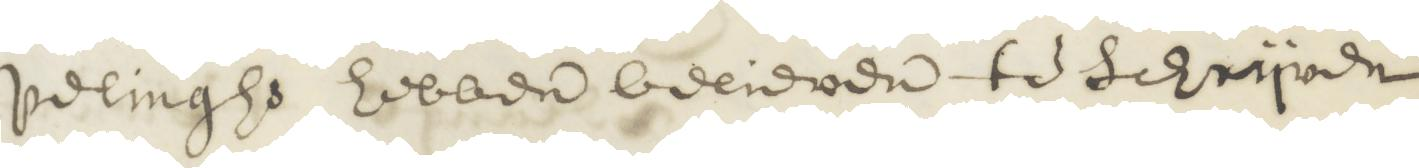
pelinghs hebben believen te schrijven
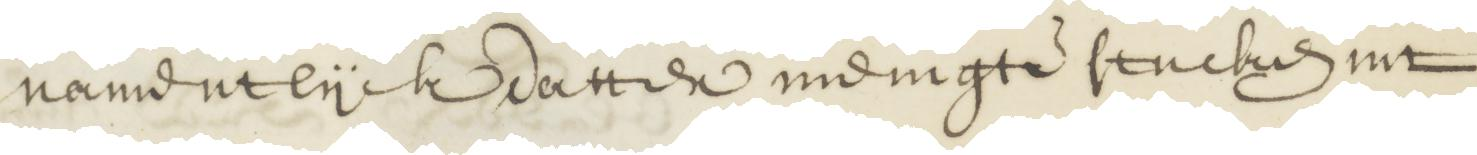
namentlijck datter menigte stucken int
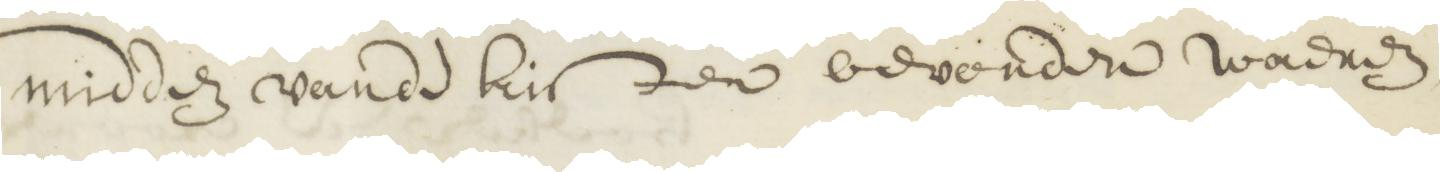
midden vande kisten bevonden waeren,
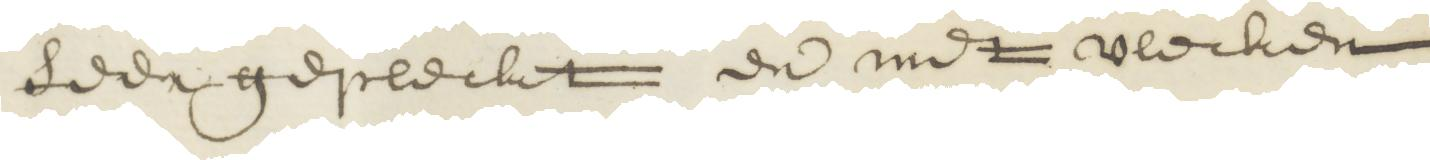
seer gepleckt en met vlecken
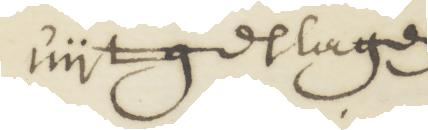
uijtgeslagen
